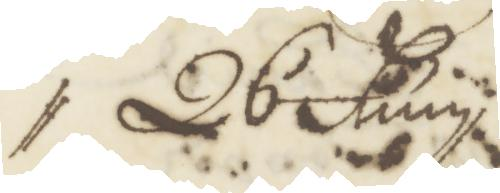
„ 26' Junij
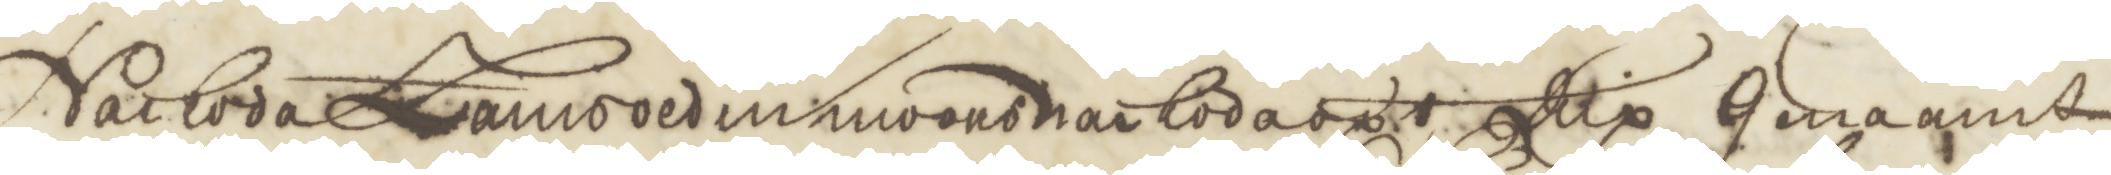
Nachoda Zamsoedin moors nachoda op 't schip genaamt
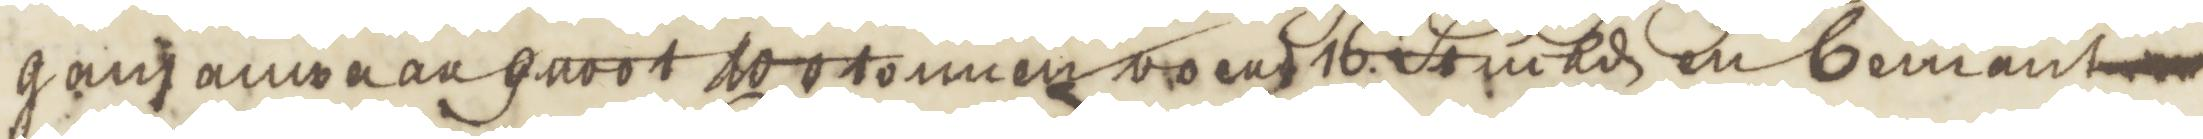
ganjamvaar groot 400 tonnen voert 16. stucken en bemant
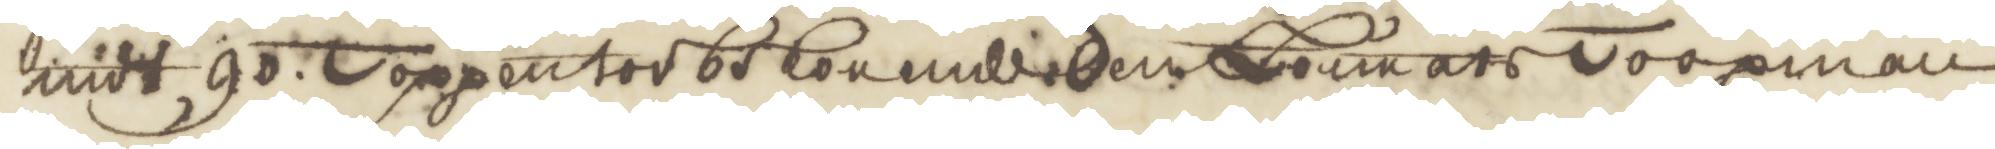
met 90.coppen toe behorende den Zourats Coopman
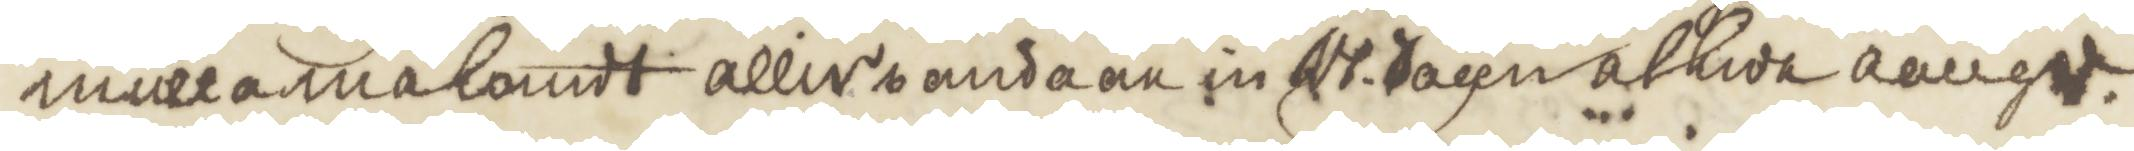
mullamahandt allie vandaar in 47. dagen alhier aange.
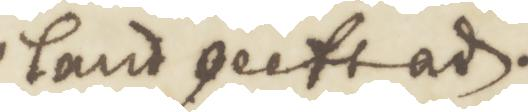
'land geeft aen.
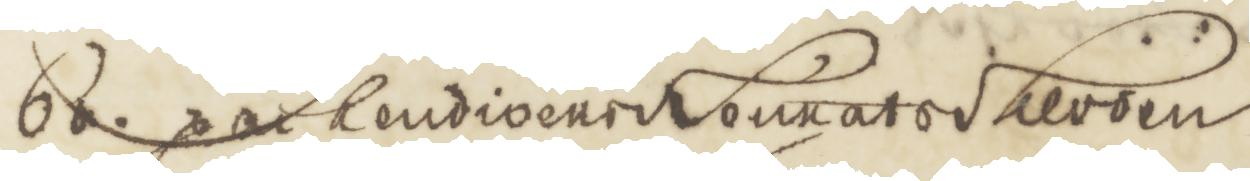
60'. packendiverse Souratse kleden
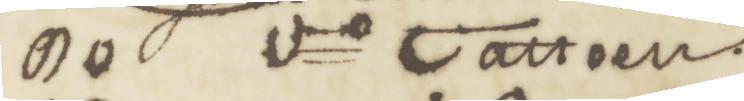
80 D=o Cattoen.
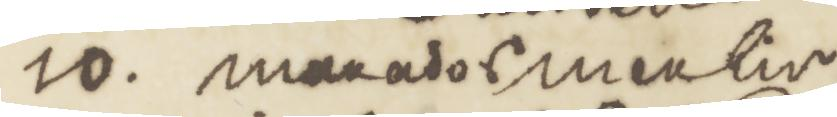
10. marados merhie
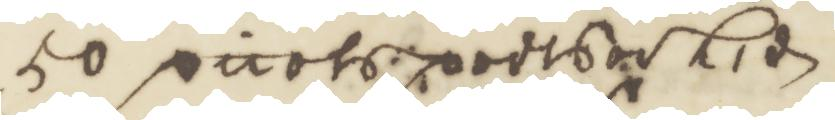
50 picols poetsoek , en
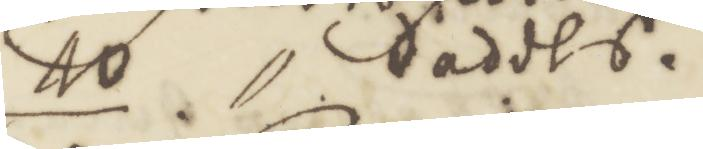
40 „ dadels.
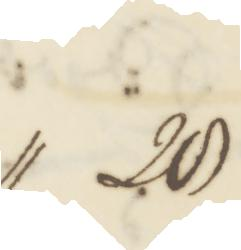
„ 28'
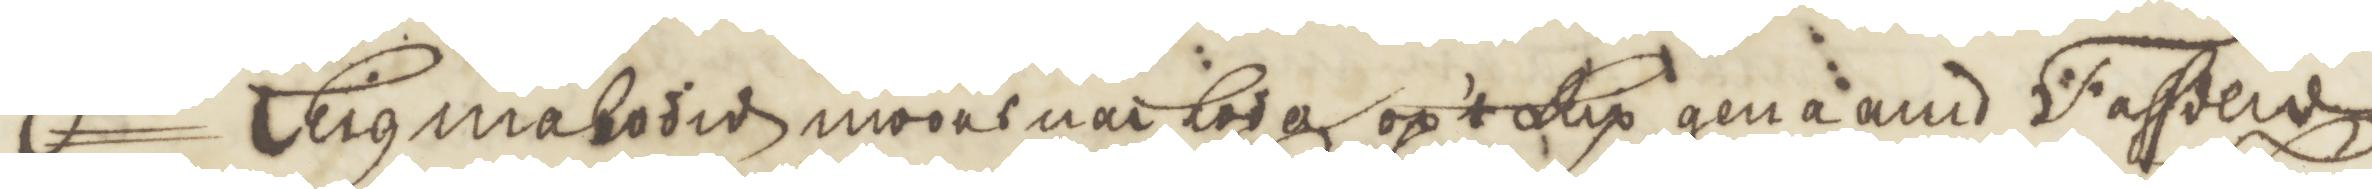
D=o Chigmahodien moors nachoda op ’t schip genaamd Fasselie
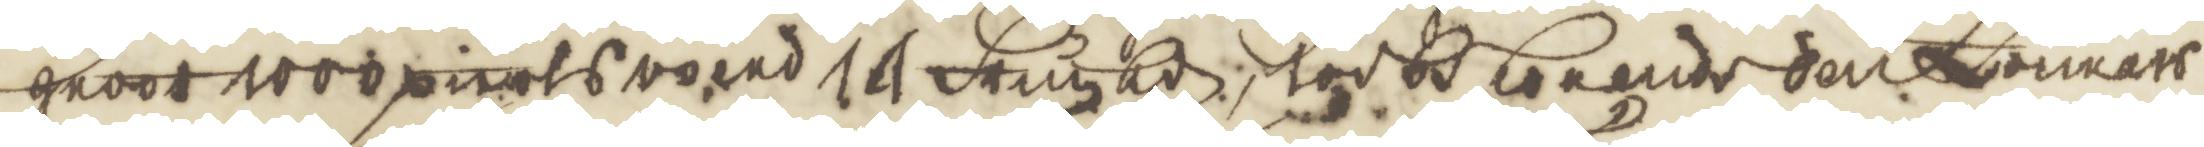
groot 1000 picols voerd 14 stucken, toe behorende den Zourats
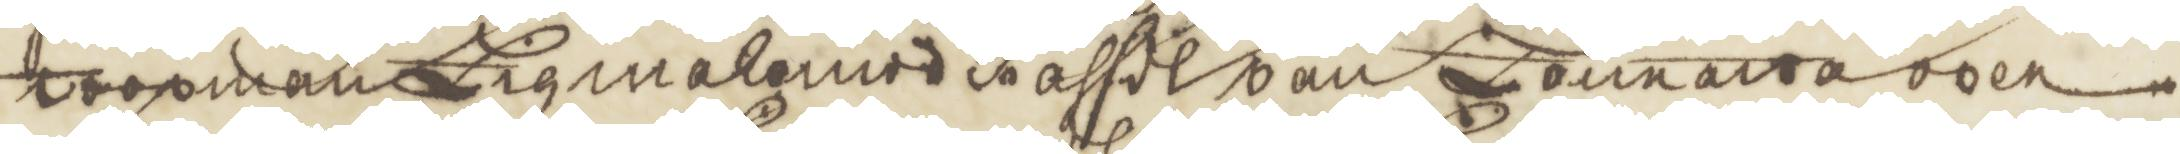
coopman Zigmahomod Fassel van Zouratta voer
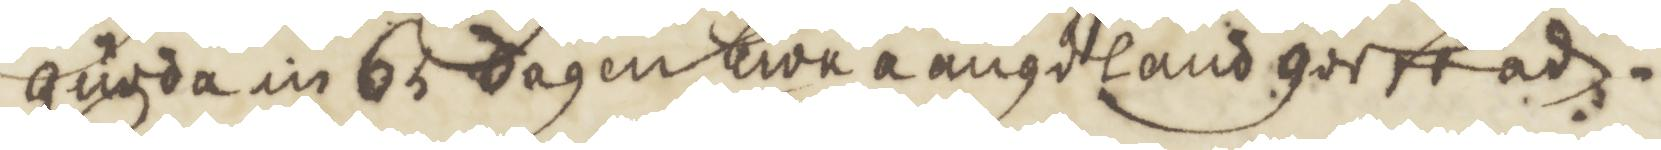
queda in 65 dagen hier aangeland geeft aen.
